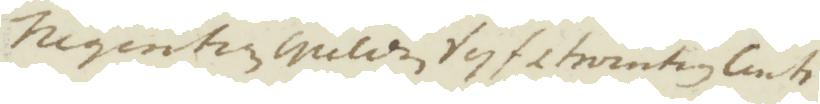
negentien gulden vyf en twintig Cents
